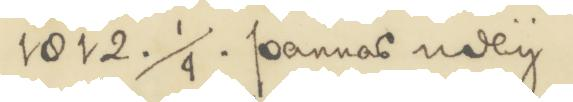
1812.¼. parras nelij
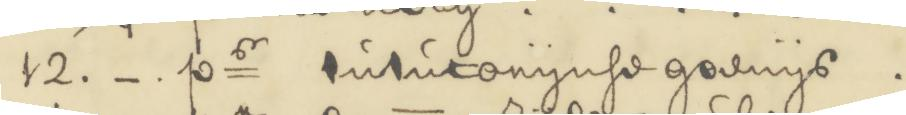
12.—. p=s tutucorijnse goenijs
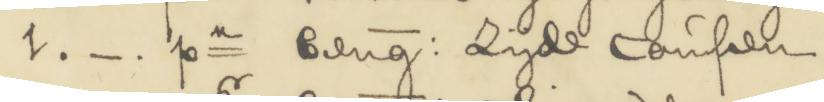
1. —. p=r beng: zijde cousen
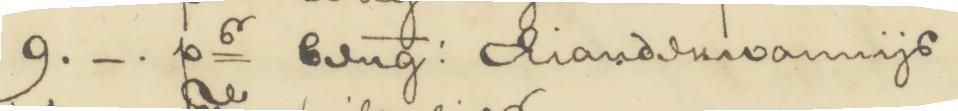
9. —. p=s beng: chiauderwannijs
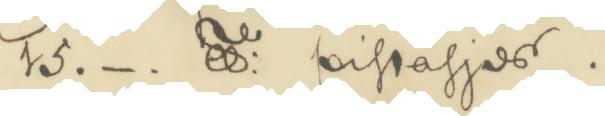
15.—. lb: pistasjes
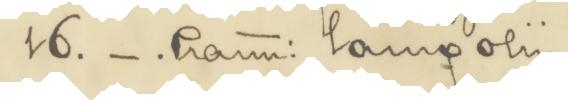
16.—. kann: lamp olij
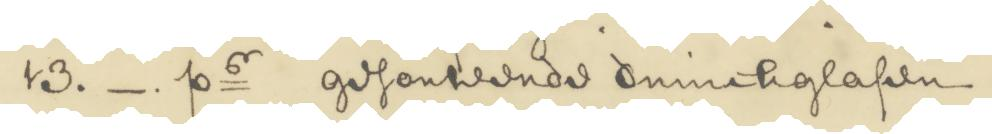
13.—. p=s gesorteerde drinckglasen
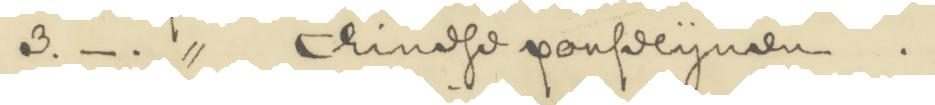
3.—. „ Chinese porselijnen .
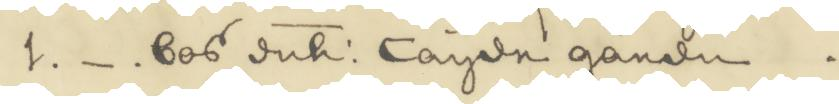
1.—. bos enk: Caijer garen
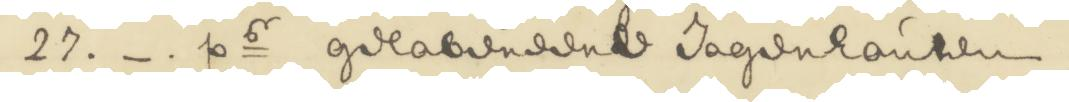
27.—. p=s gelabereerde Iagerhouten
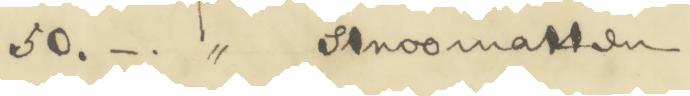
50.—. „ stroomatten
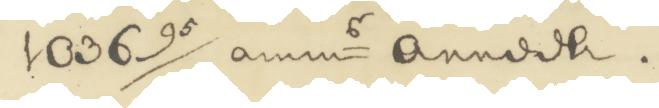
1036 95/104 amm=s arreek.
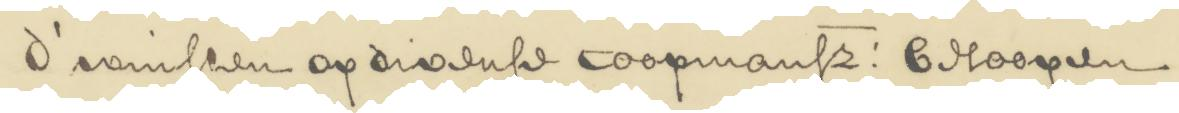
d’ winsten op diverse coopmansz: beloopen
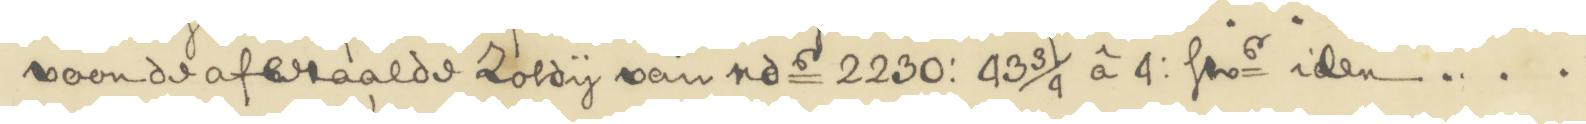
voor de afbetaalde zoldij van rd=s 2230: 43 ¾ â 4: stv=s ider
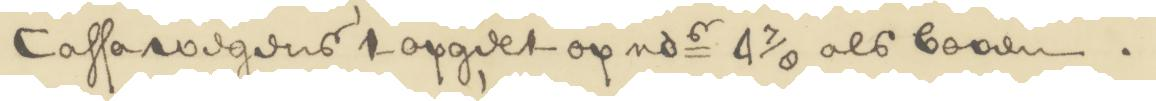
Cassa wegens ’t opgelt op rd=s 4 7/8 als boven .
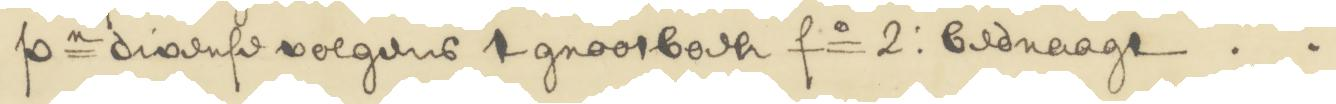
p=r diverse volgens 't grootboek f=o 2: bedraagt . .
